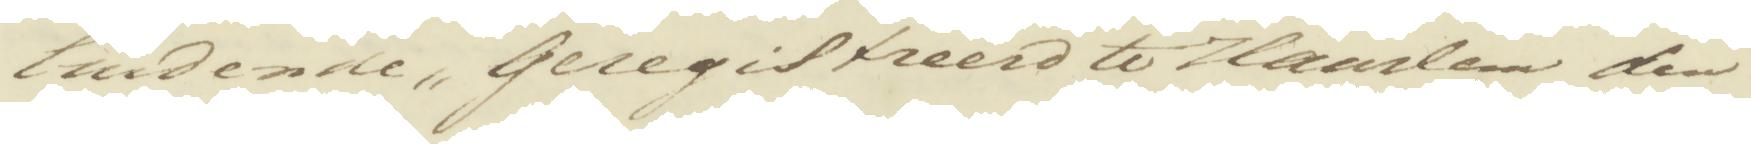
luidende, geregistreerd te Haarlem den
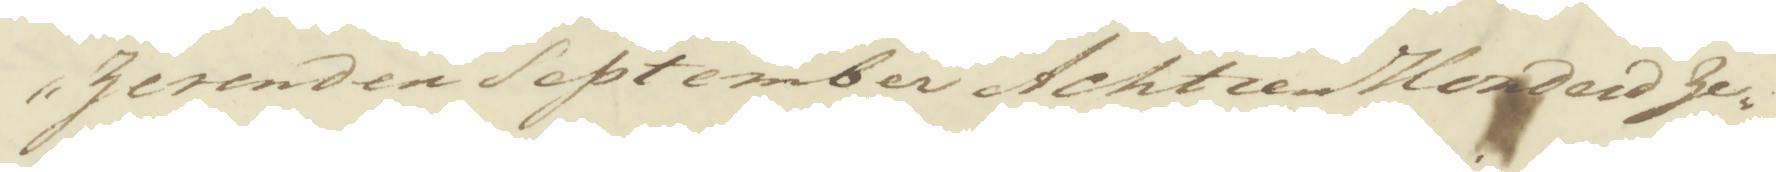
„ Zevenden September Achtien Honderd Ze„
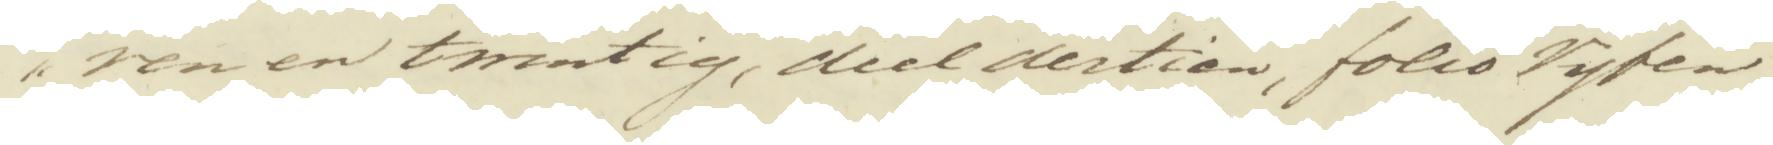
„ ven en twintig, deel dertien, folio Vyfen
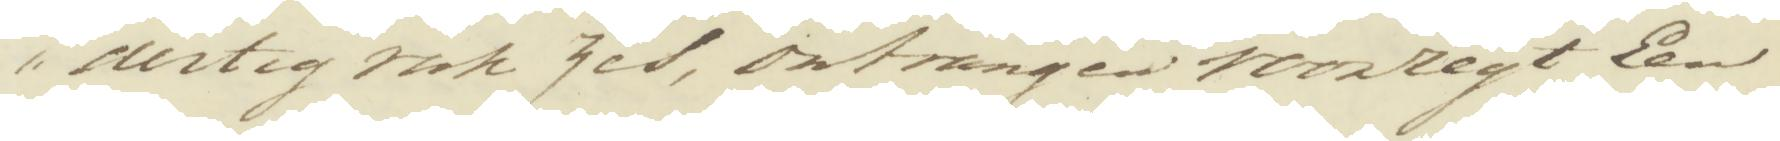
„ dertig vak Zes, ontvangen voorregt Een
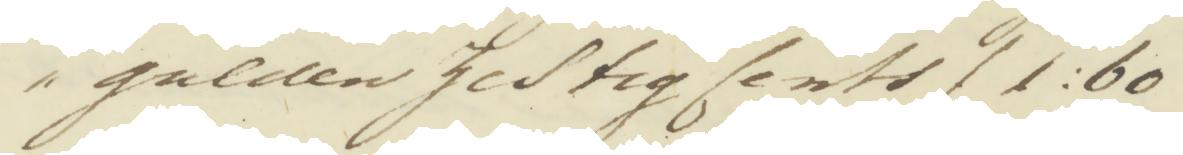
„ gulden Zestig Cents ƒ 1:60
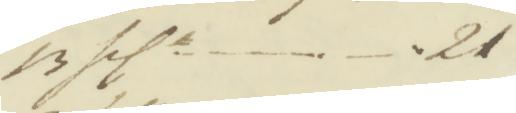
13 pC.t - - - . — „ 21
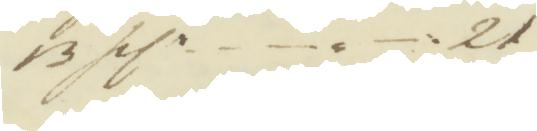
13 pC-t - — „ — „ 21
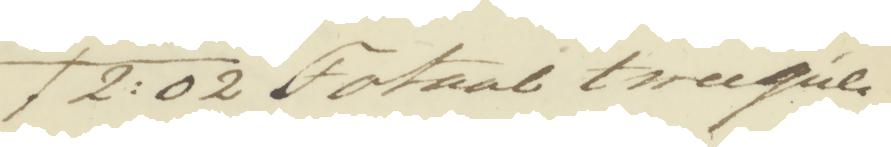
ƒ 2:02 Totaal twee gul
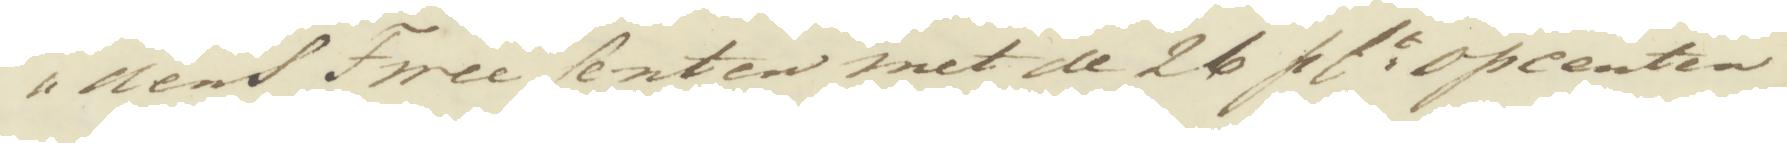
„ dens Twee Centen met de 26 pC:t opcenten
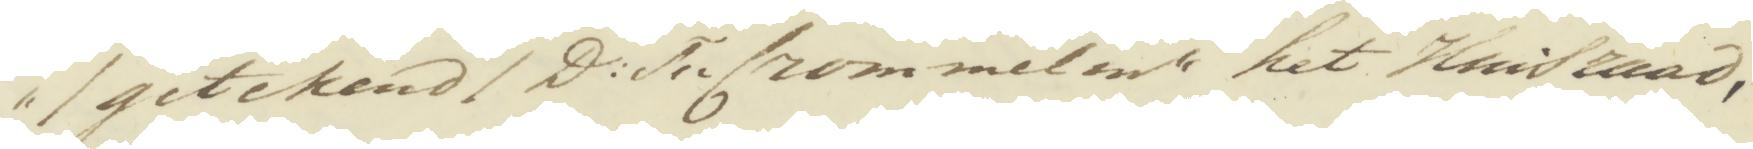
„ /getekend / D:F: Crommelin het Huisraad,
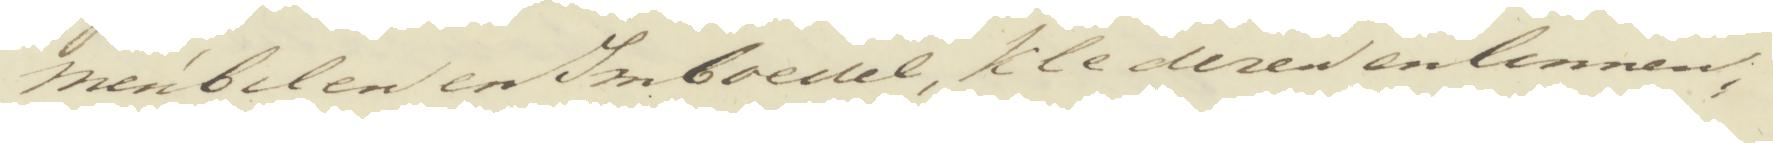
meubilen en Imboedel, klederen en linnen„
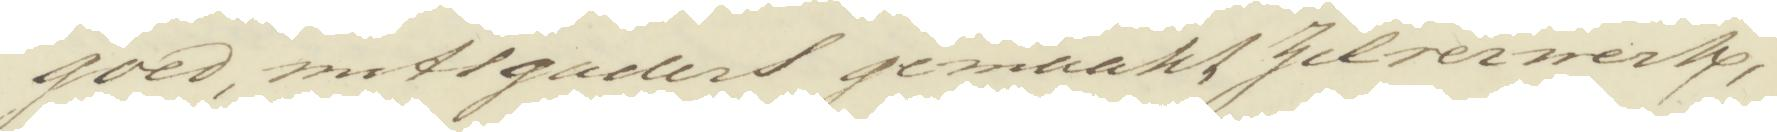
goed, mitsgaders gemaakt Zilverwerk,
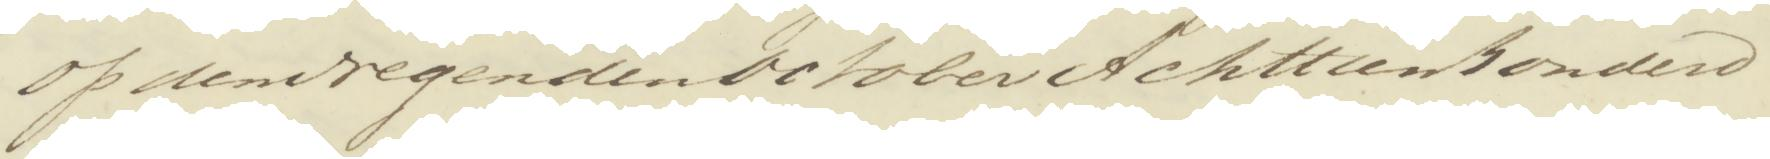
op den Negenden October Achttienhonderd
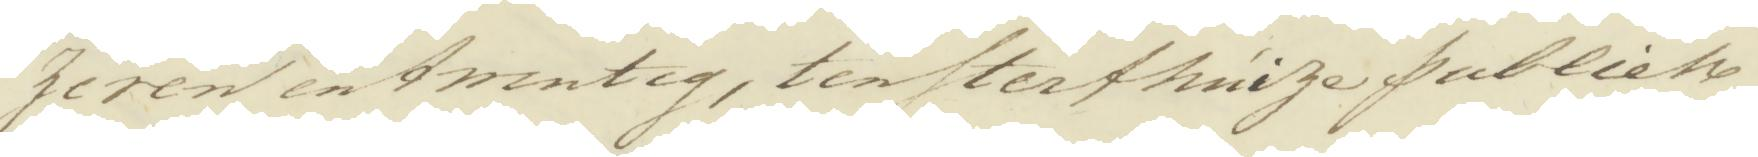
Zeven en twintig, ten sterfhuize publiek
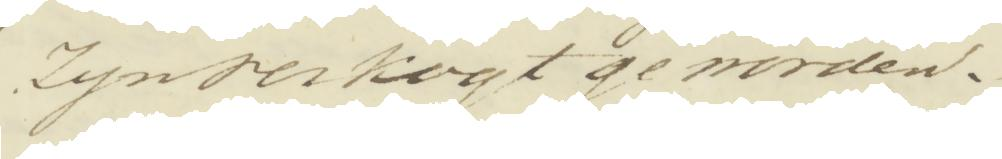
zyn verkogt geworden.
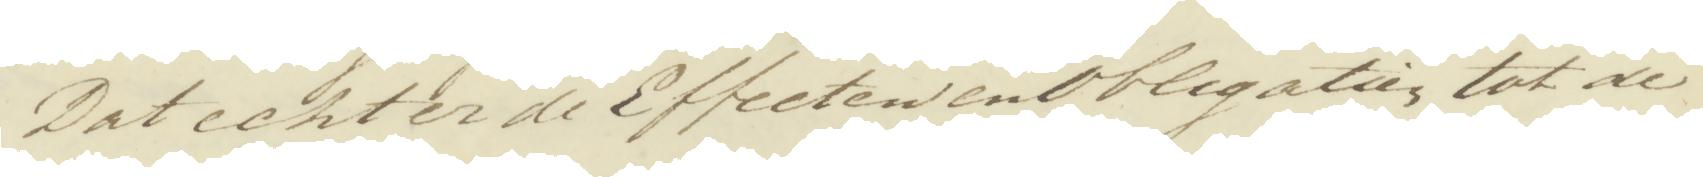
Dat echter de Effecten en obligatien tot de
